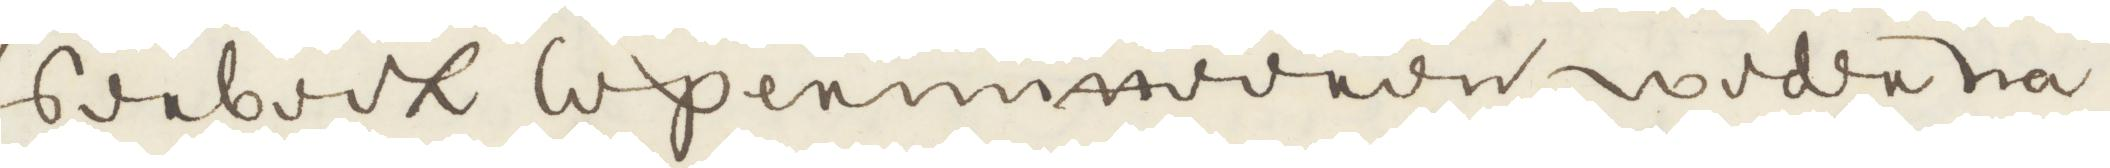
serbeek te permitteeren weder na
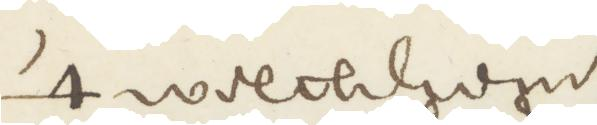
’t welck hem
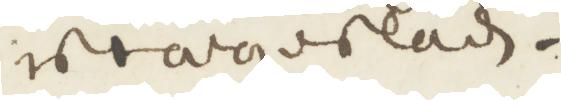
is toegestaen.
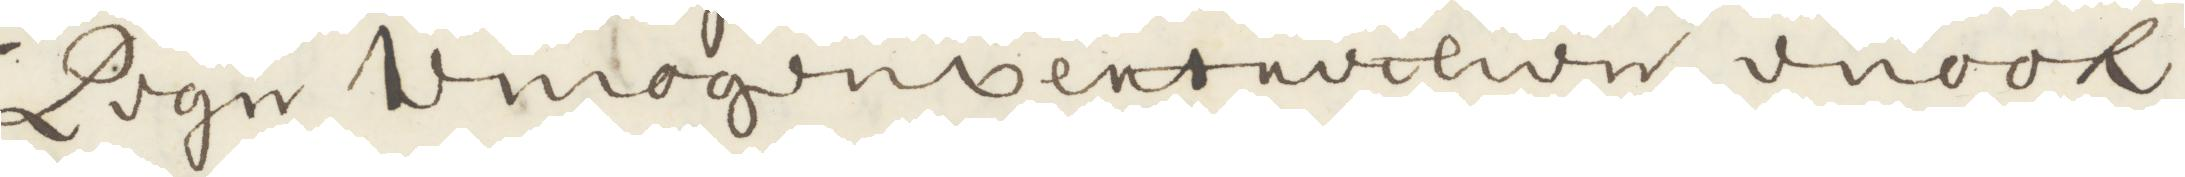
Pegu te mogen vertrecken en ook
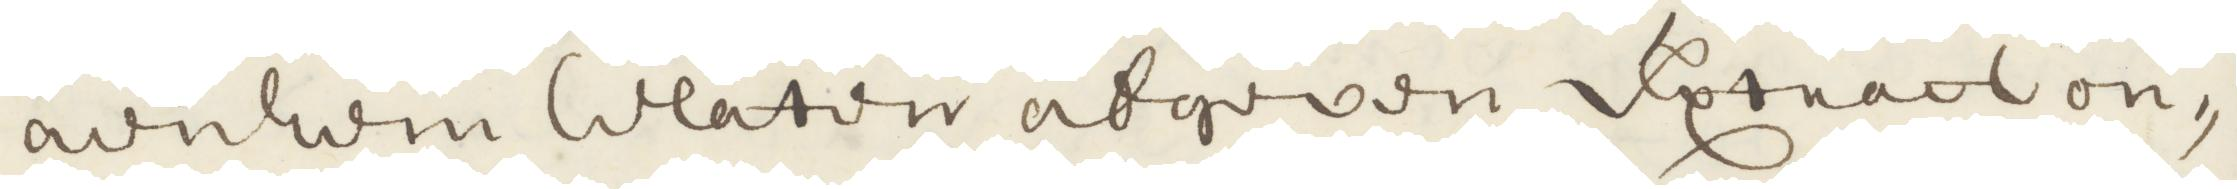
aen hem te laten afgeven Extract on„
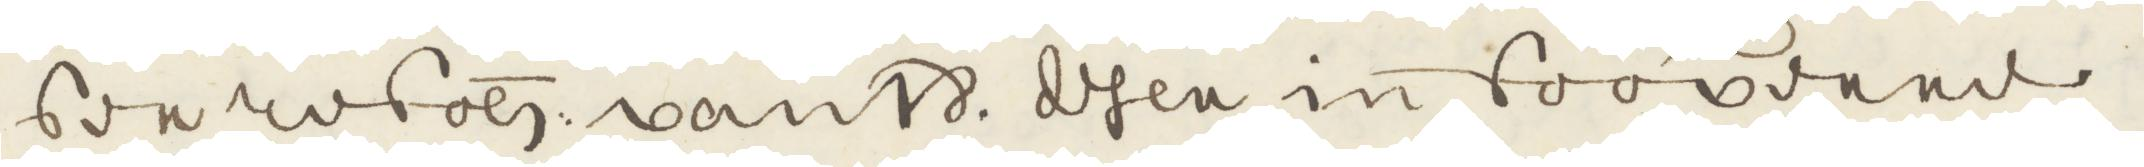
ser resol: van 18. deser in sooverre
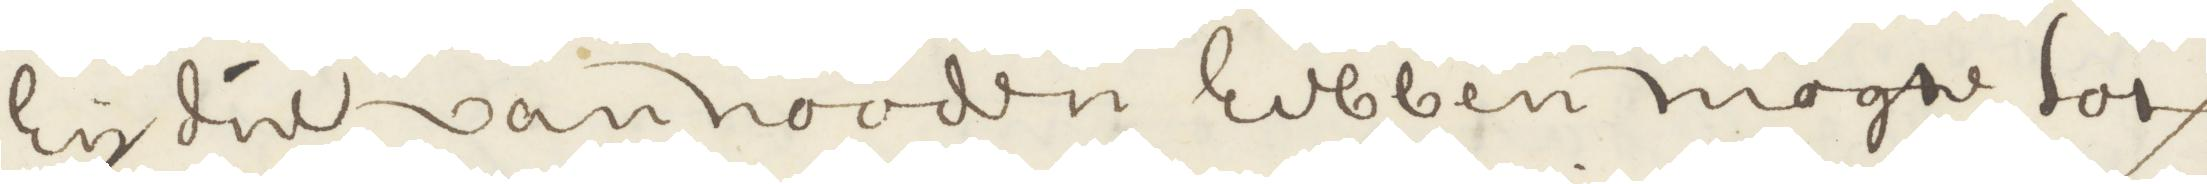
hij die van nooden hebben mogte tot
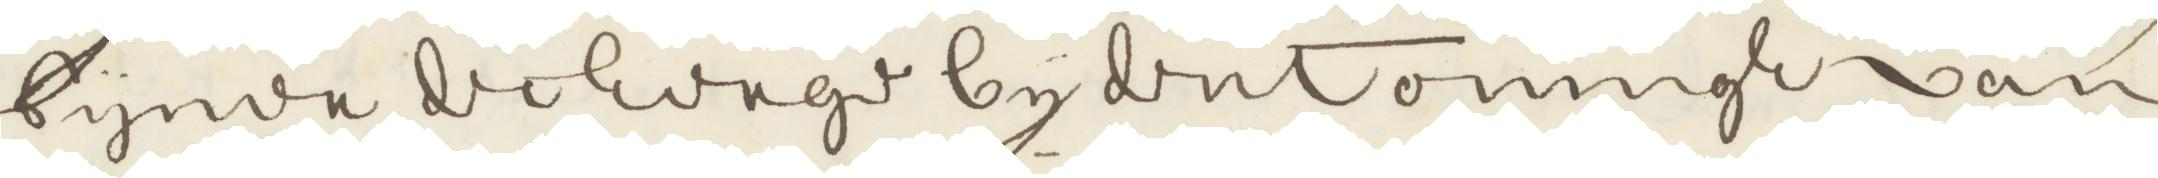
sijner de cherge bij den Coningh van
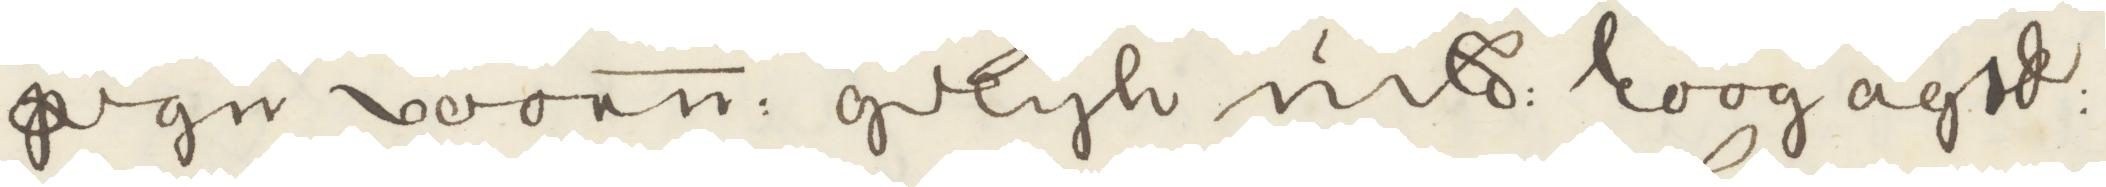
pegu voorn: gelijk uEd: hoog agtb:
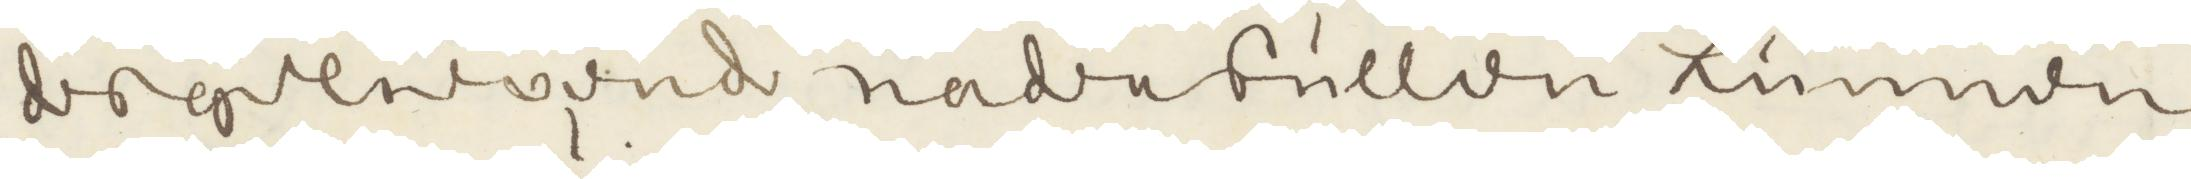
des gelievende nader sullen kunnen
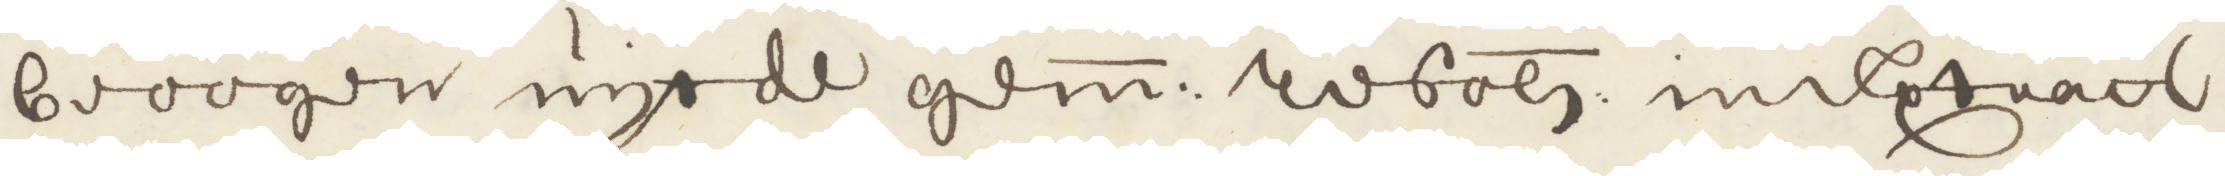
beoogen uijt de gem: resol: in Extract
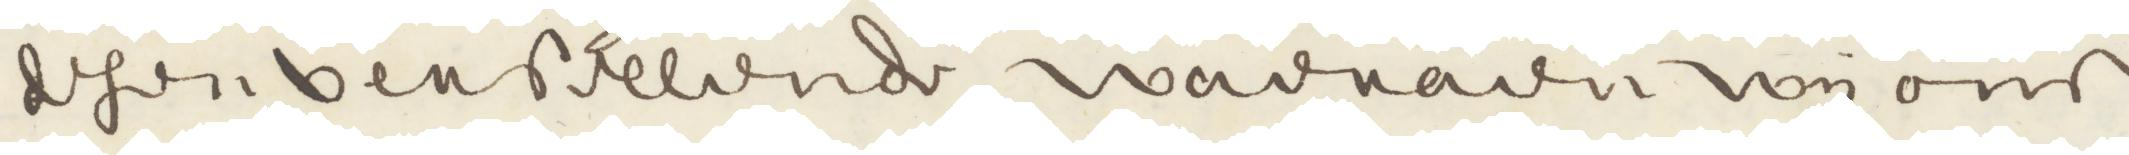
desen versellende, waeraen wij ons
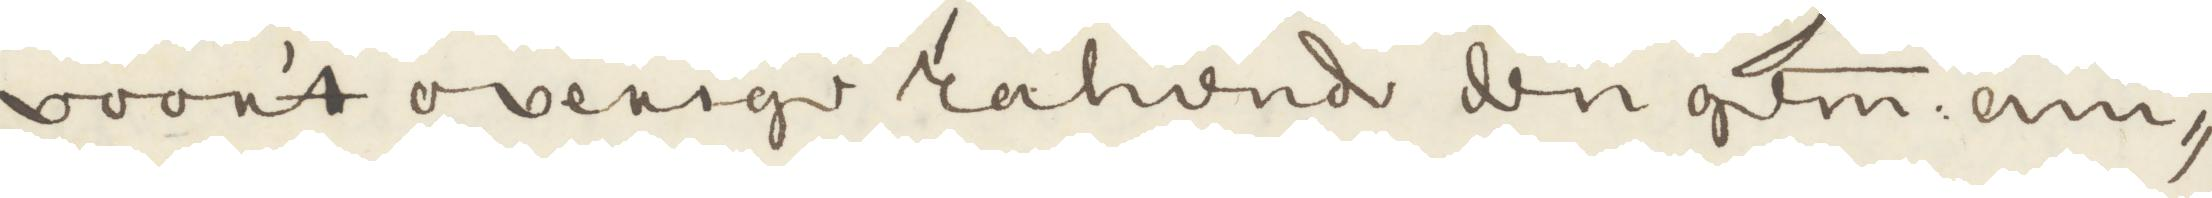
voor ’t overige rakende den gem: am„
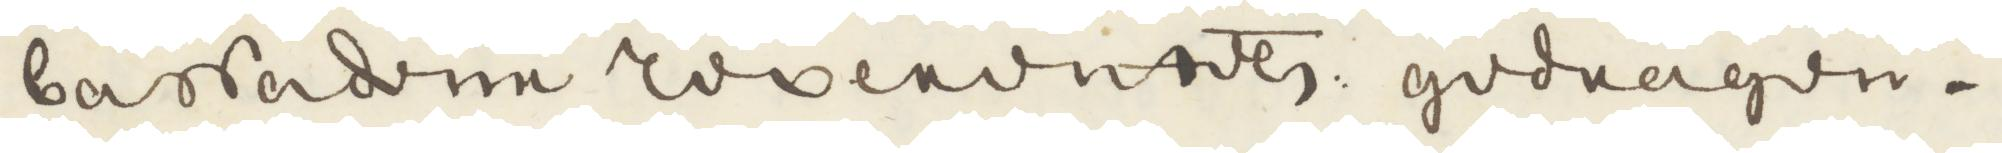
bassadeur reverentelijk gedragen.
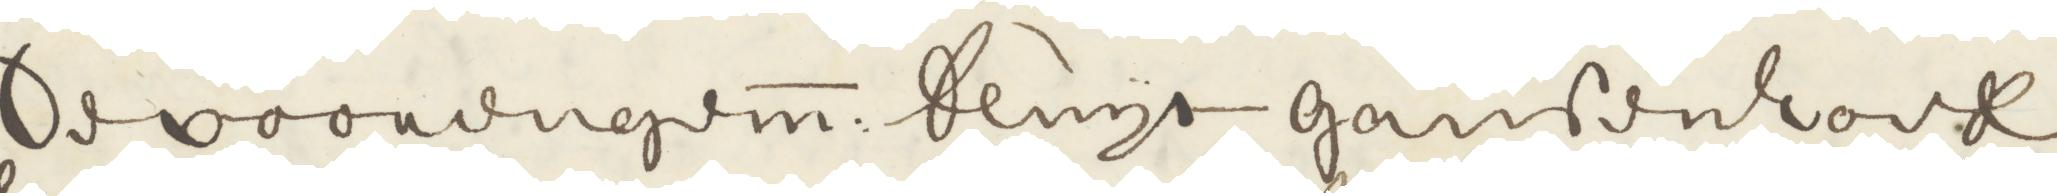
De voorengem: fluijt gansenhoef
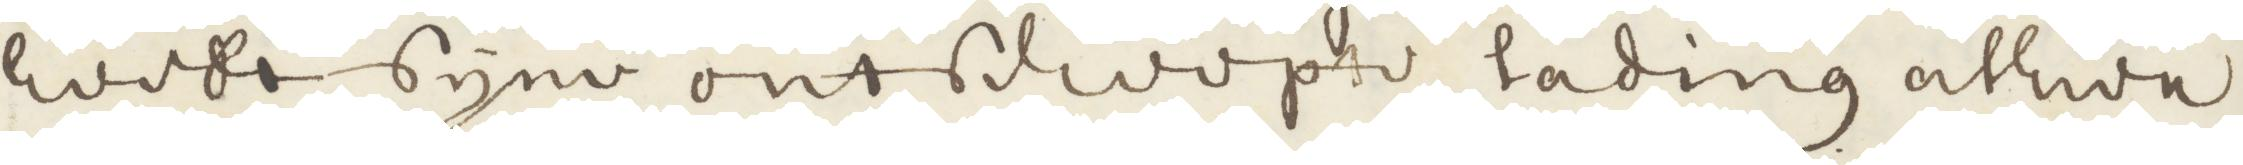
heeft sijne ontscheepte lading alhier
